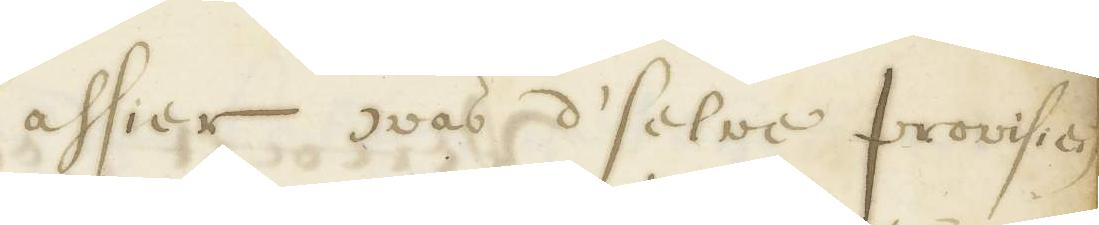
assier was d’selve provisien
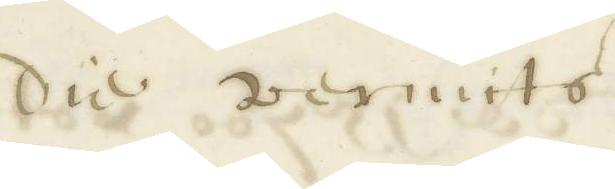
die vermits
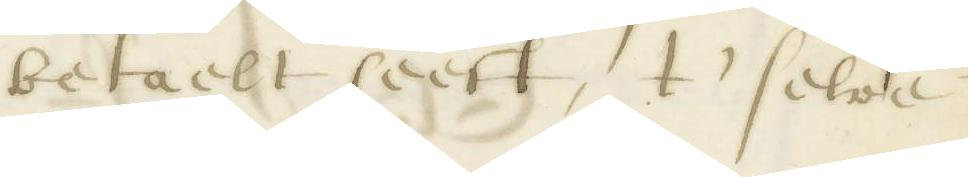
ingecocht en betaelt heeft, 't selve
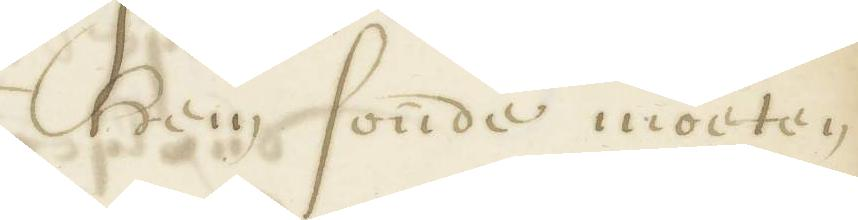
hem soude moeten
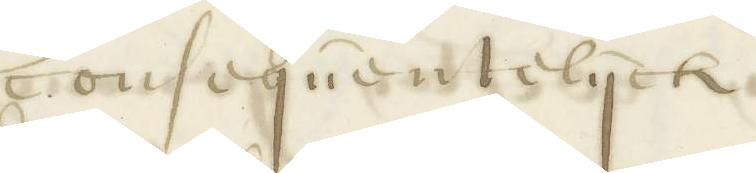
consequentelijck
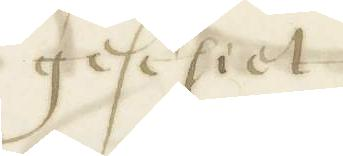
geschiet
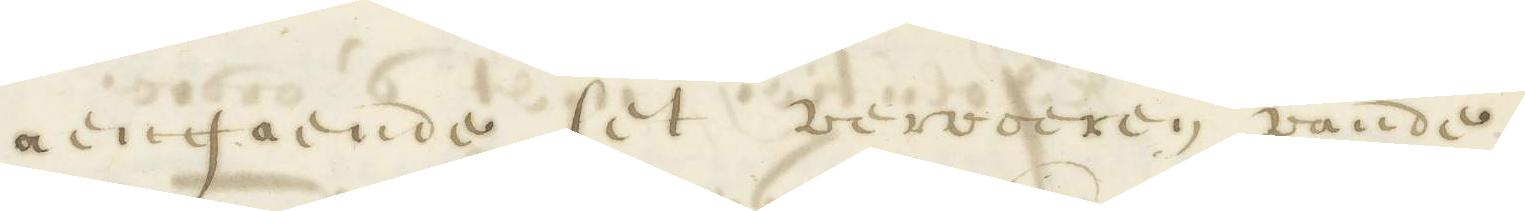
aengaende het vervoeren vande
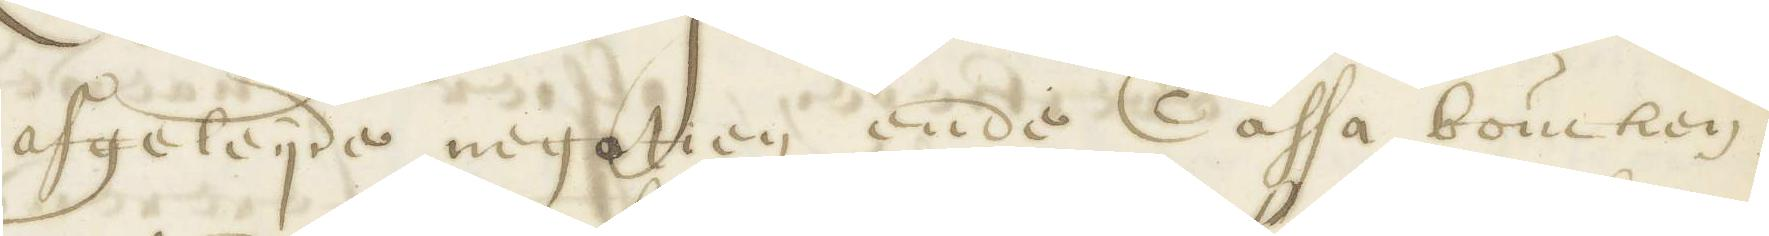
afgeleijde negotien ende Cassa boucken
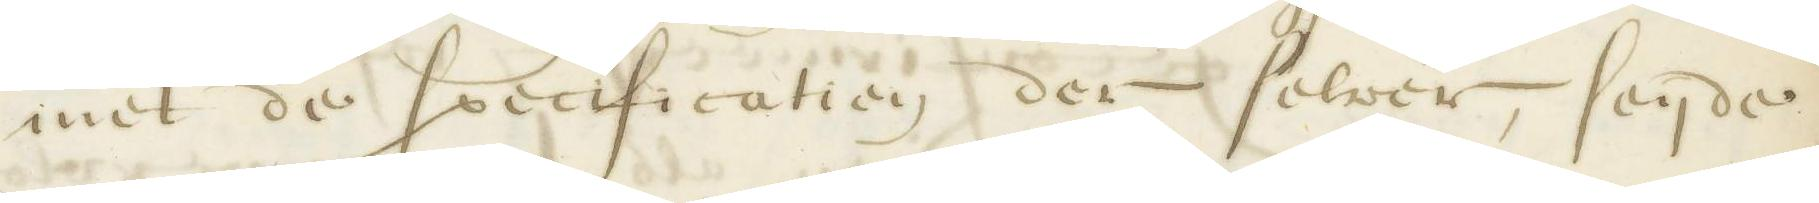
met de specificatien der selver, seijde
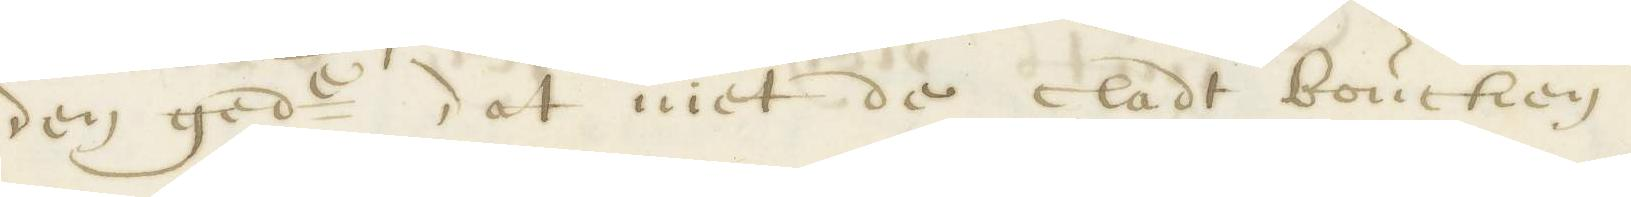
den ged=e dat niet de cladt boucken
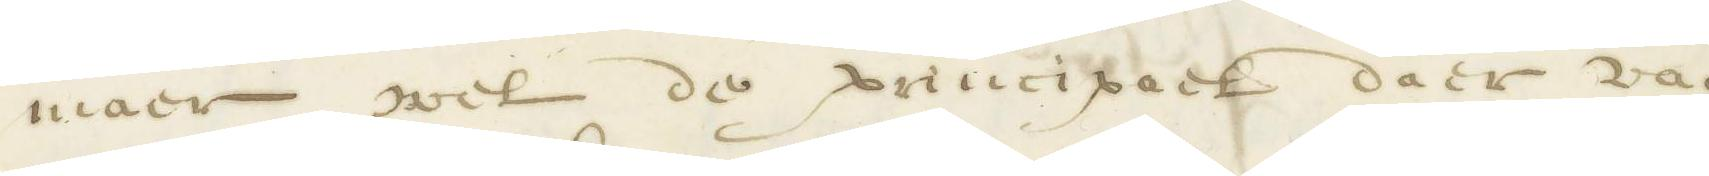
maer wel de principael daer van
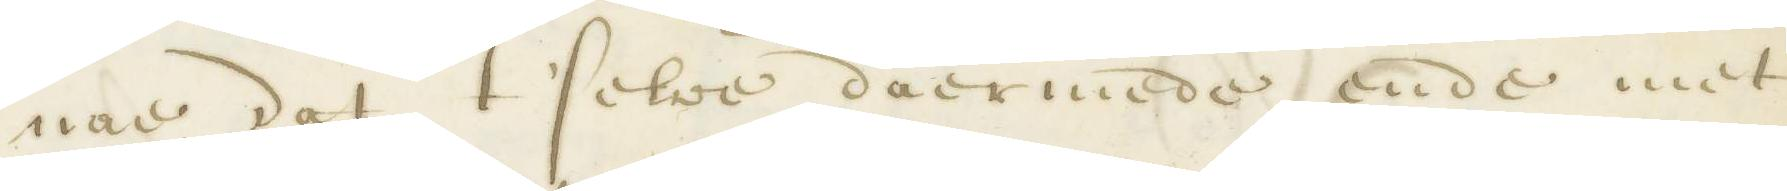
nae dat t'selve daermede ende met
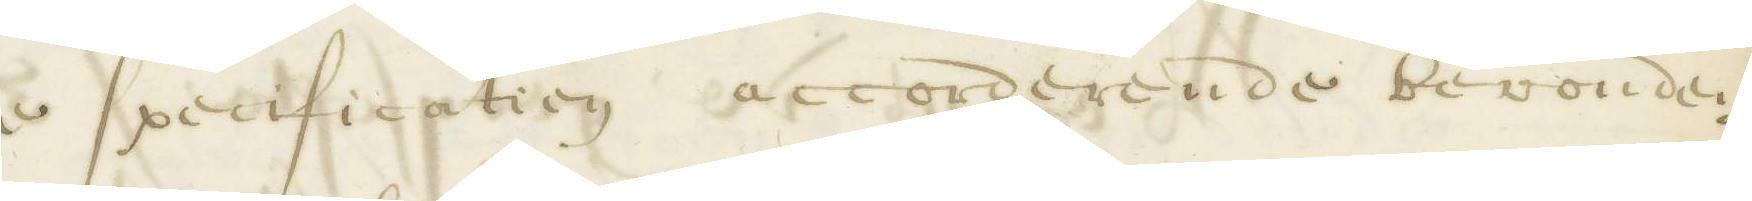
de specificatien accorderende bevonden
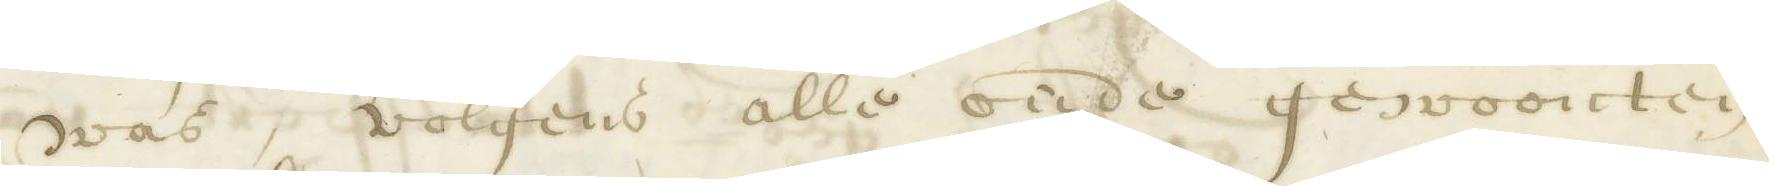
was, volgens alle oude gewoonten
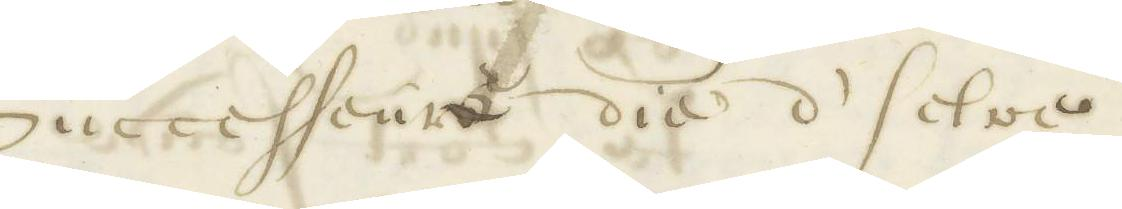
Successeur die d’ selve
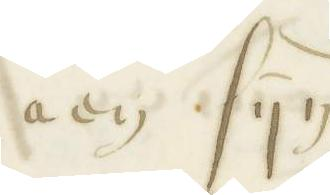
aen sijn
